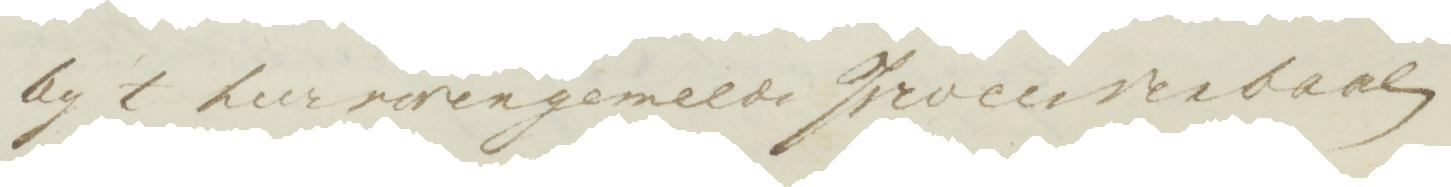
bij ’t hier vorengemelde Proces verbaal
